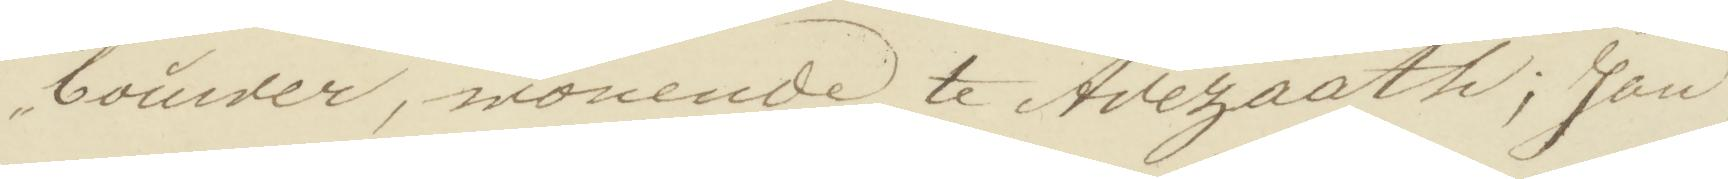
„bouwer, wonende te Avezaath; Jan
